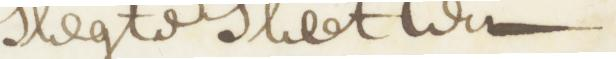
slegte sleet ten
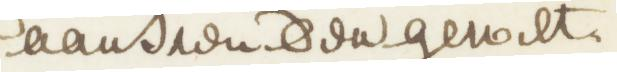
aansien der gewilt„
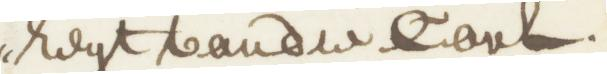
„heyt van die Corl.
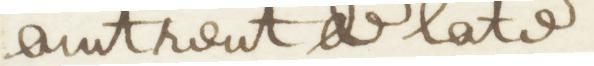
omtrent de late
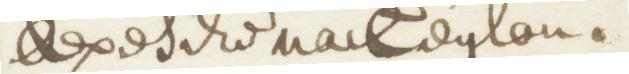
depesche na Ceijlon.
